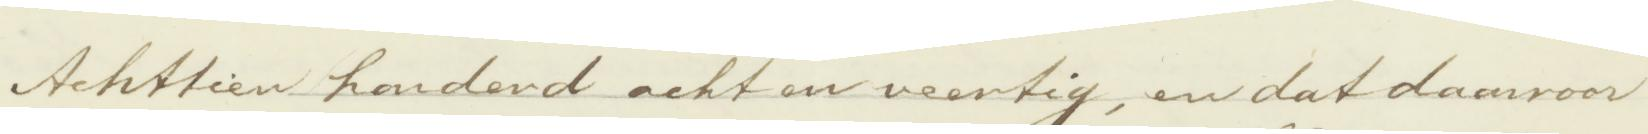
Achttien honderd acht en veertig, en dat daarvoor
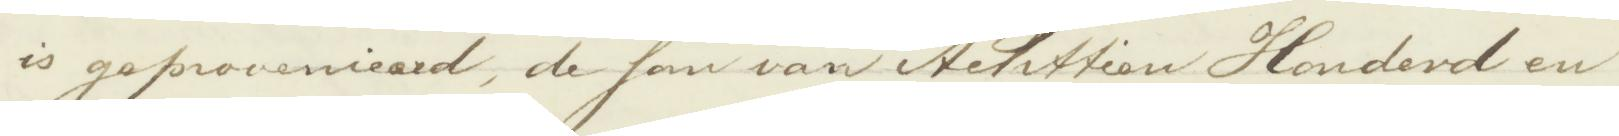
is geprovenieerd, de som van Achttien Honderd en
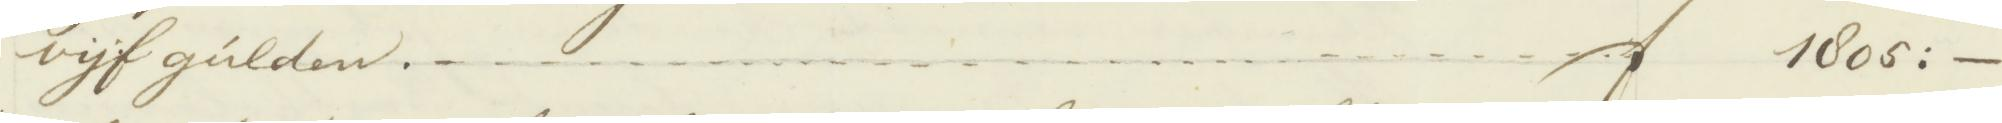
vijf gulden. - - - - - - - - - - - - - - - - - - - - - - - - - - - - - - . ƒ 1805: —
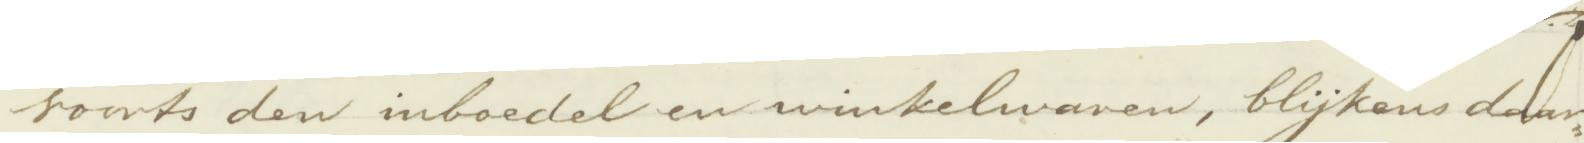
voorts den inboedel en winkelwaren, blijkens daar„
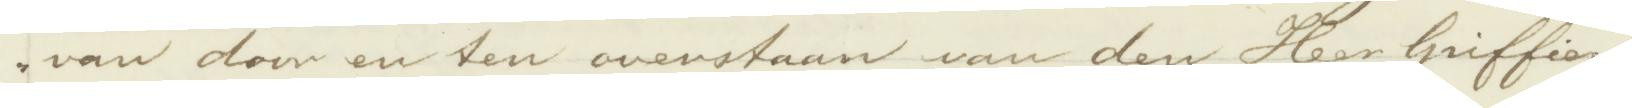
„van door en ten overstaan van den Heer Griffier
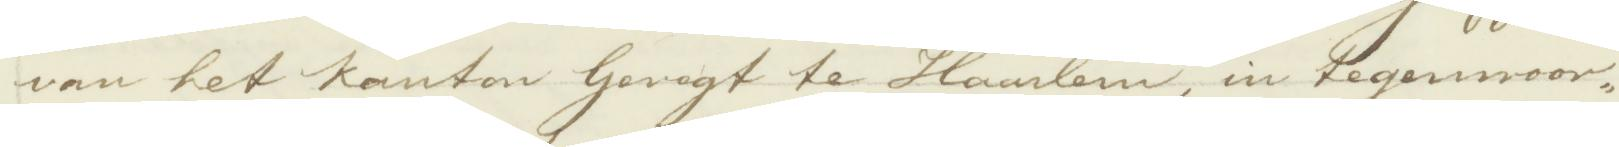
van het kanton Geregt te Haarlem, in tegenwoor„
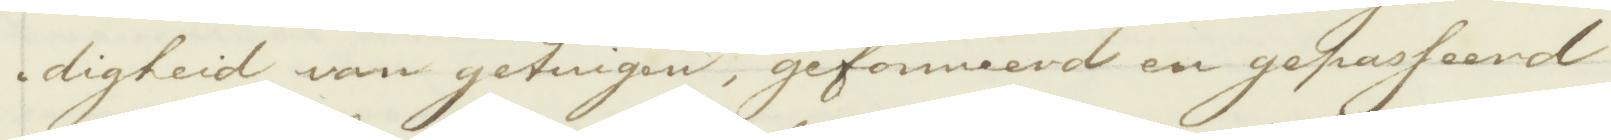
„digheid van getuigen, geformeerd en gepasseerd
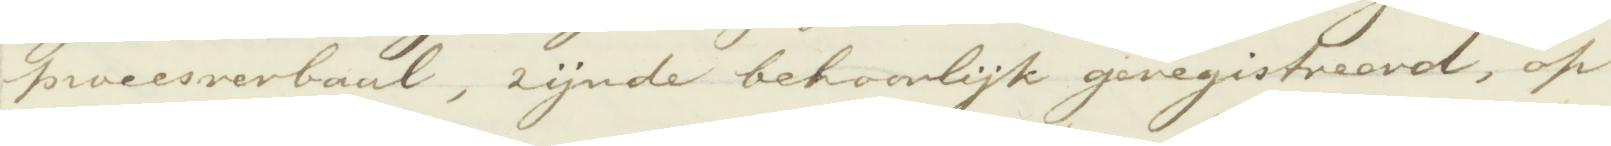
procesverbaal, zijnde behoorlijk geregistreerd, op
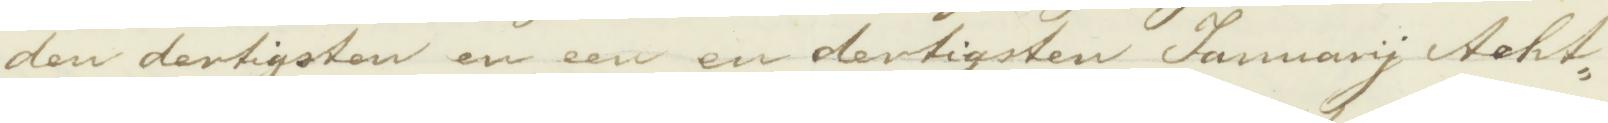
den dertigsten en een en dertigsten Ianuarij Acht„
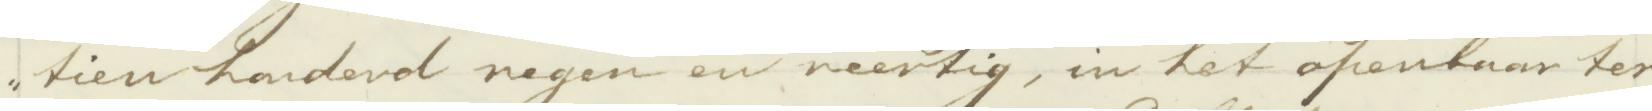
„tien honderd negen en veertig, in het openbaar ter
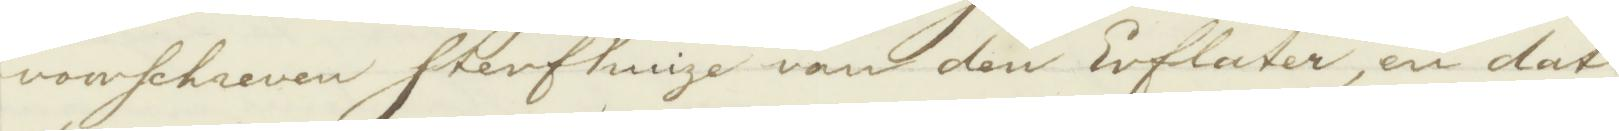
voorschreven sterfhuize van den Erflater, en dat
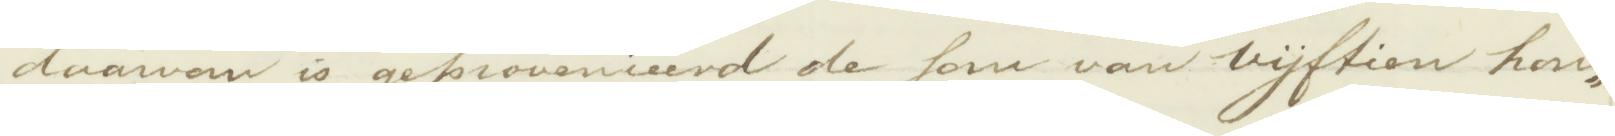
daarvan is geprovenieerd de som van vijftien hon„
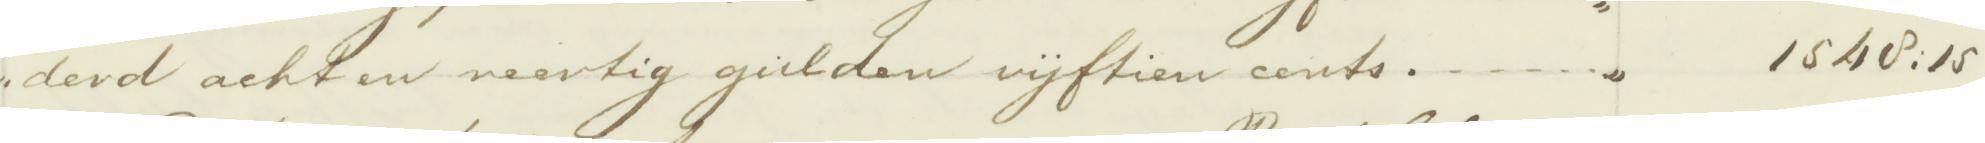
derd acht en veertig gulden vijftien cents. - - - - - „ 1548:15
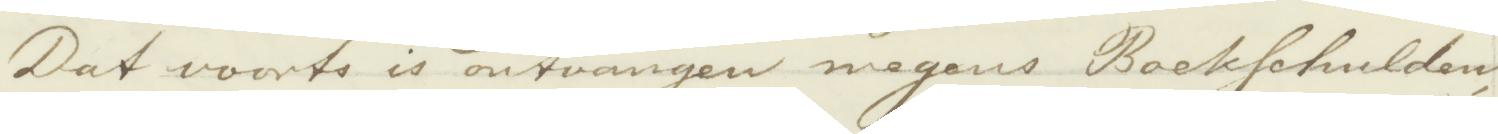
Dat voorts is ontvangen wegens Boekschulden,
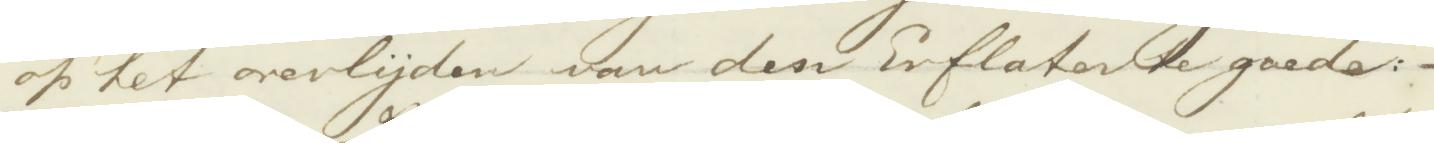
op het overlijden van den Erflater te goede:
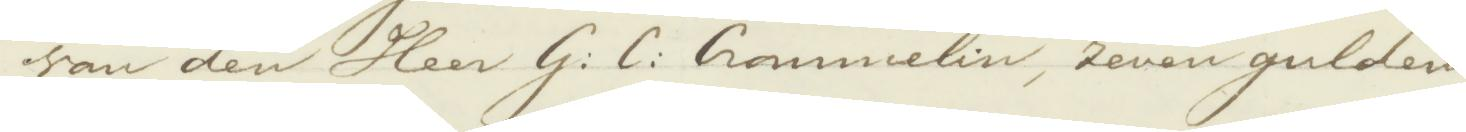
van den Heer G: C: Crommelin, zeven gulden
